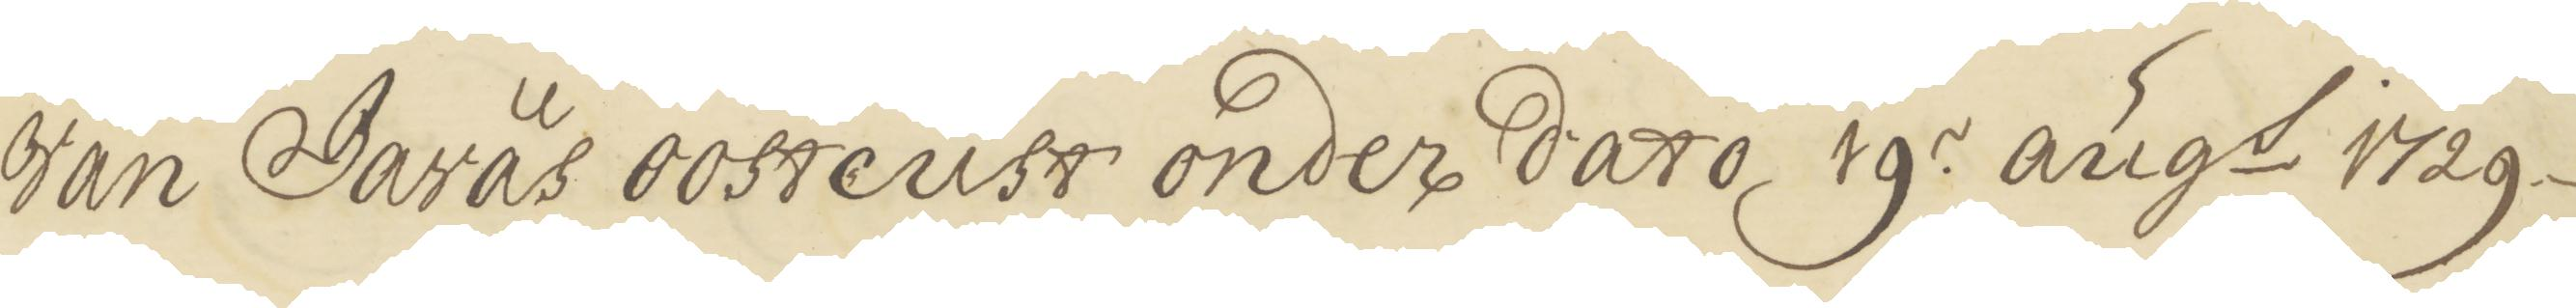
Van Javâs oostcust onder dato 19.' aug-s 1729.
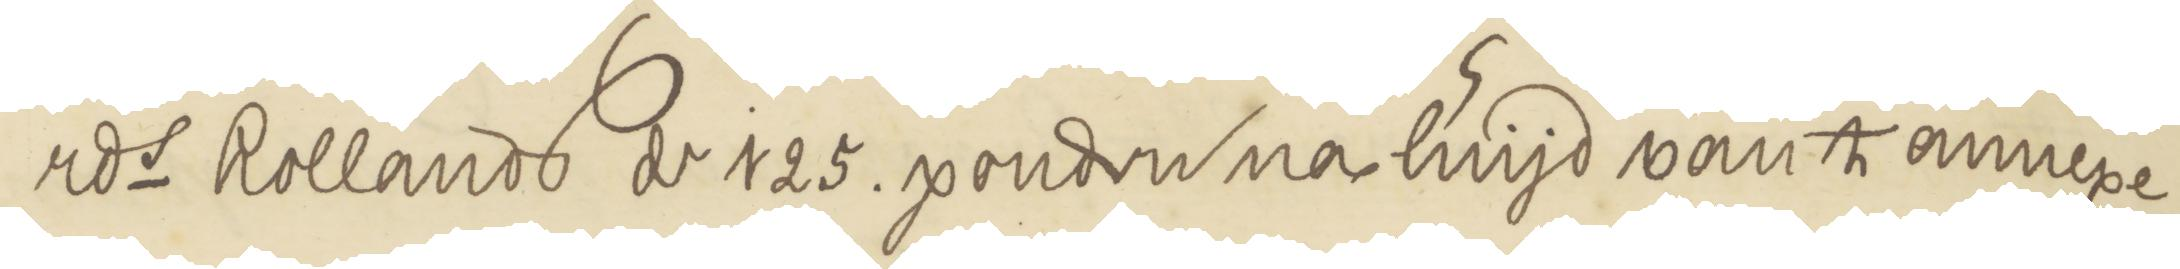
rd-s hollands de 125. ponden na luijd van't annexe
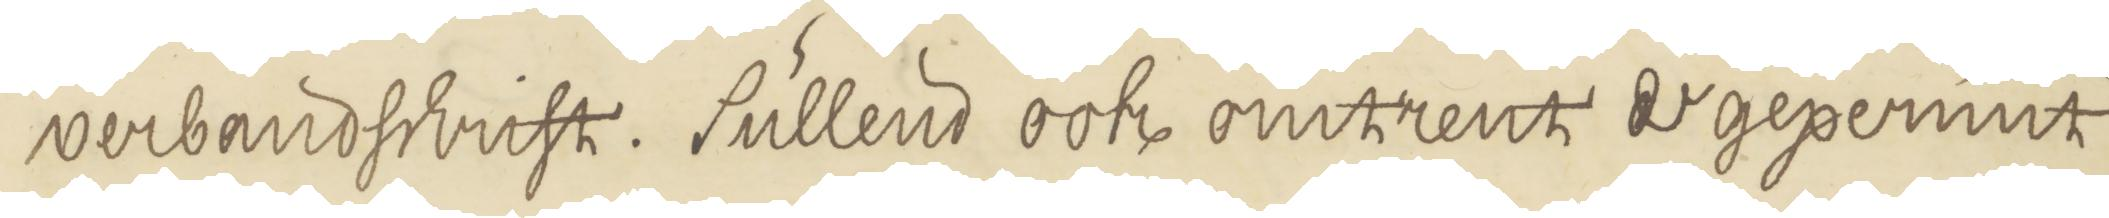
verbandschrift. sullend ook omtrent de gepermit
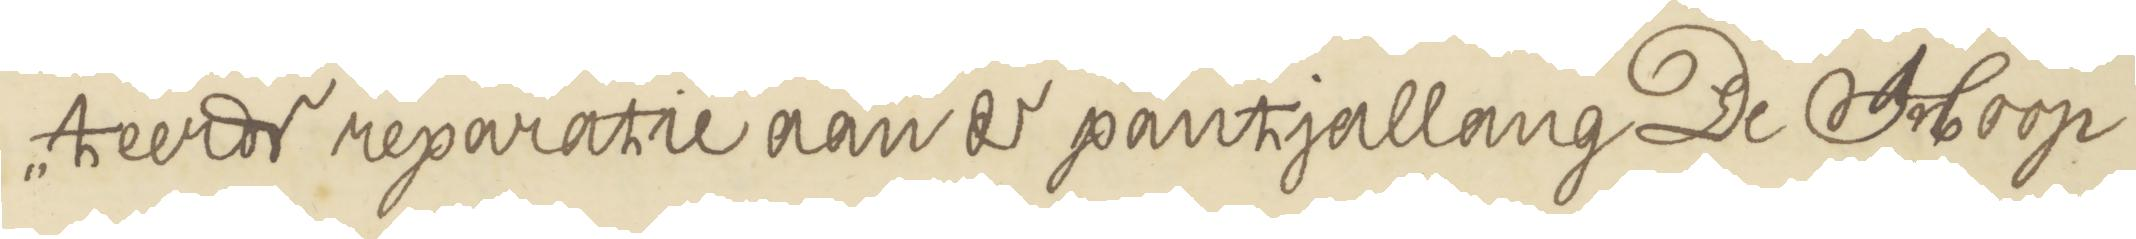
„teerde reparatie aan de pantjallang De Hoop
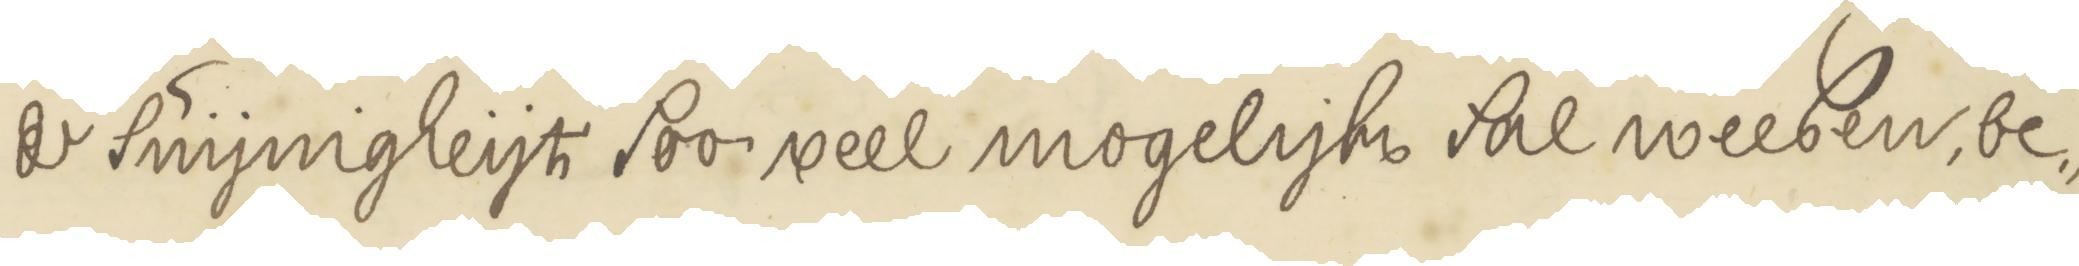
de suijnigheijt soo veel mogelijk sal weesen, be„
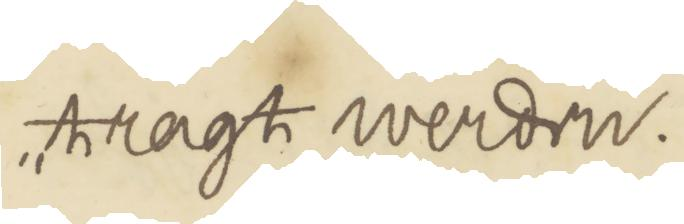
„tragt werden.
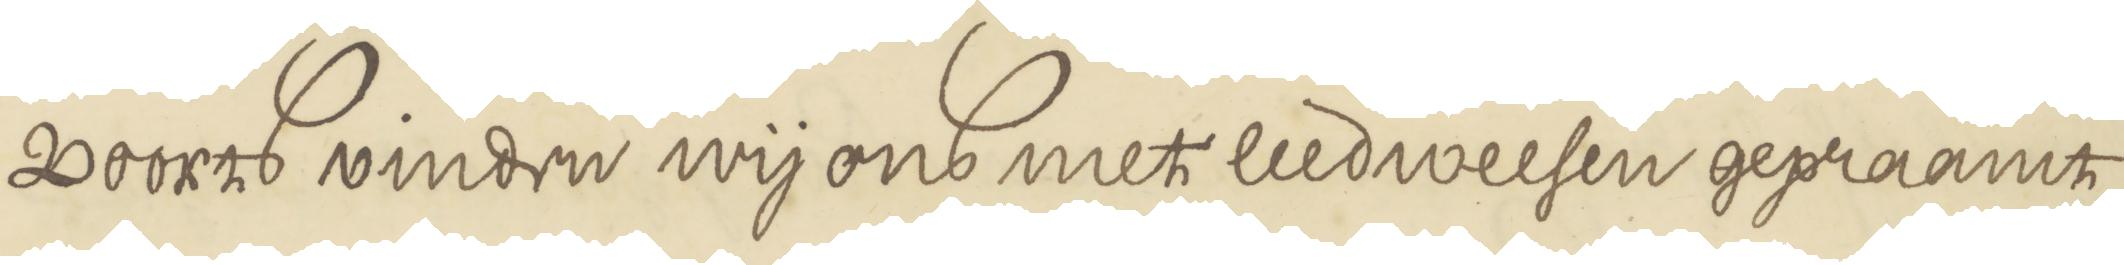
voorts vinden wij ons met leedweesen gepraamt
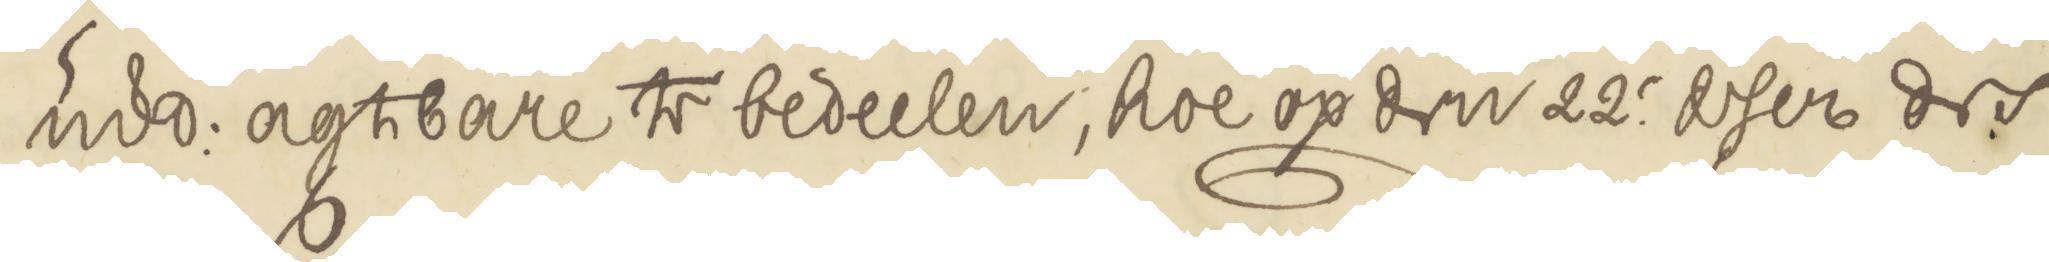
uEd: agtbare te bedeelen, hoe op den 22.' deser des
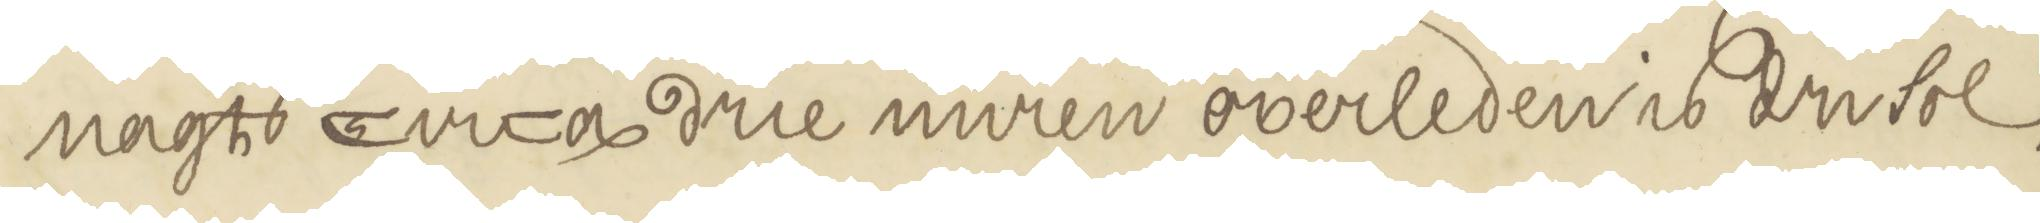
nagts circa drie uuren overleden is den sol
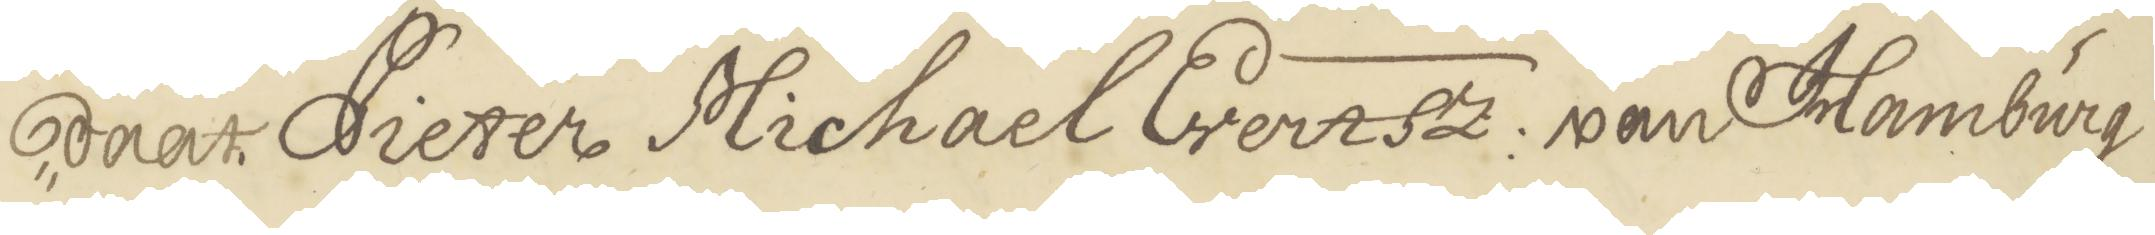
„daat Pieter Michael Evertsz: van Hamburg
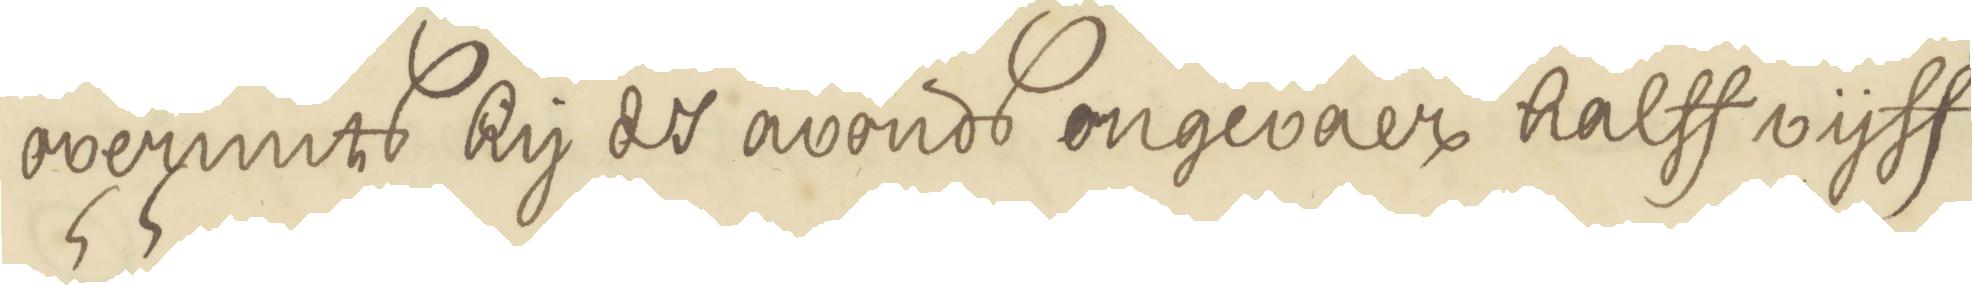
overmits hij des avonds ongevaer halff vijff
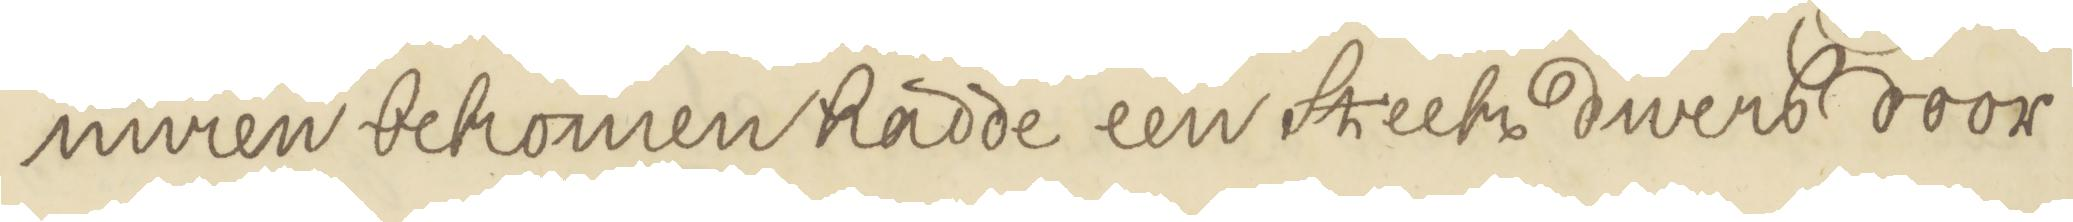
uuren bekomen hadde een steek dwers door
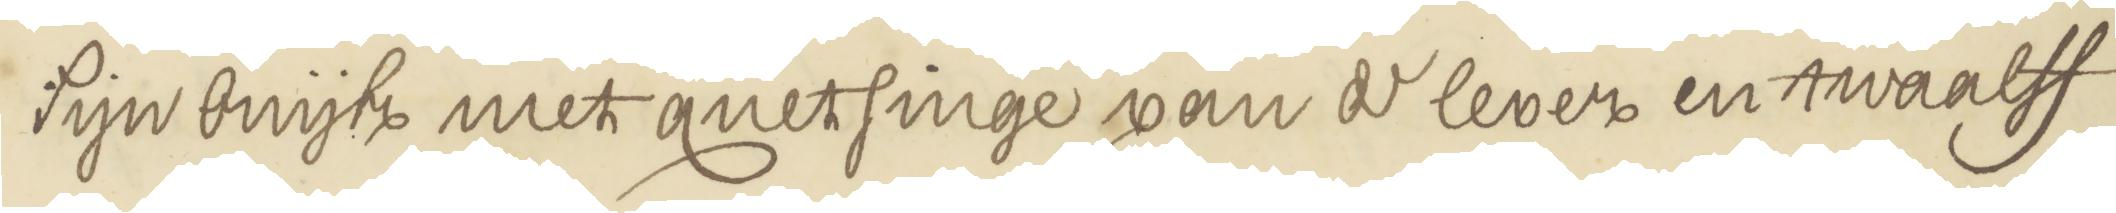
sijn buijk met quetsinge van de lever en twaalff
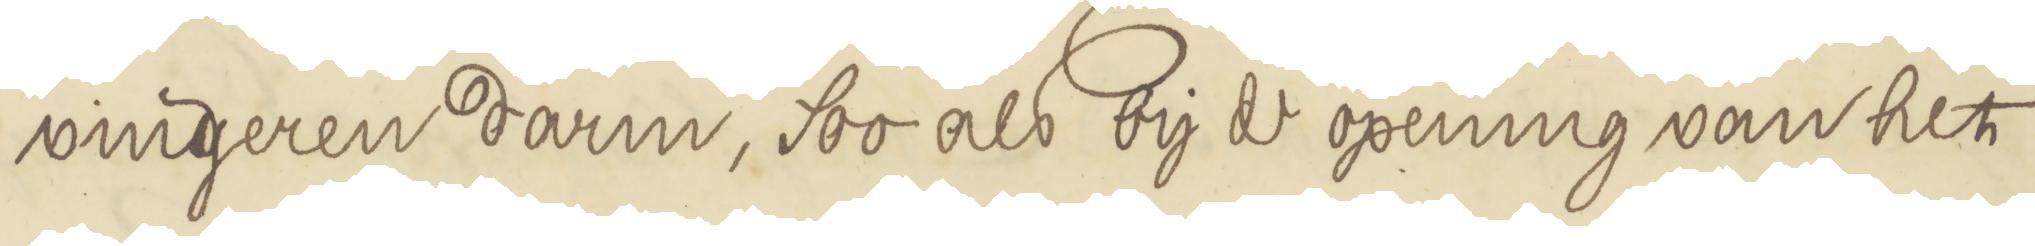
vingeren darm, soo als bij de opening van het
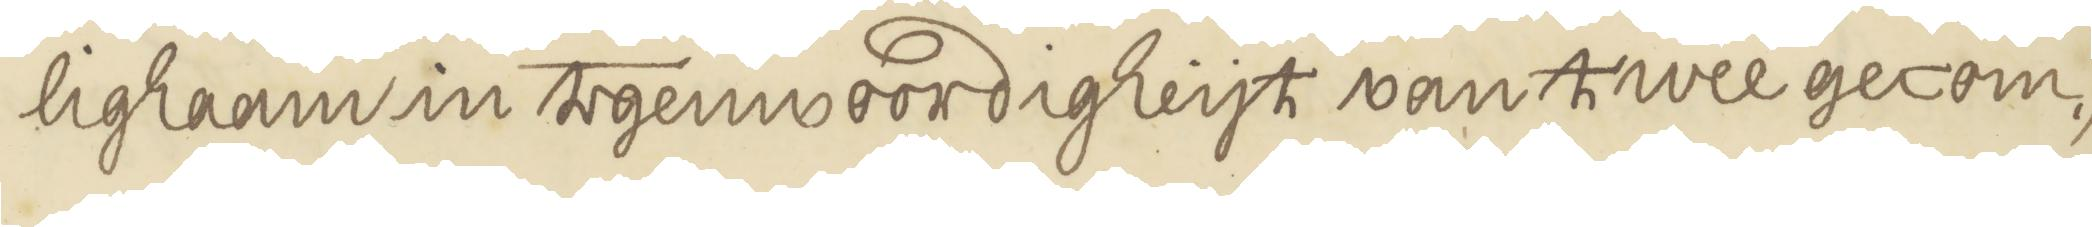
lighaam in tegenwoordigheijt van twee gecom
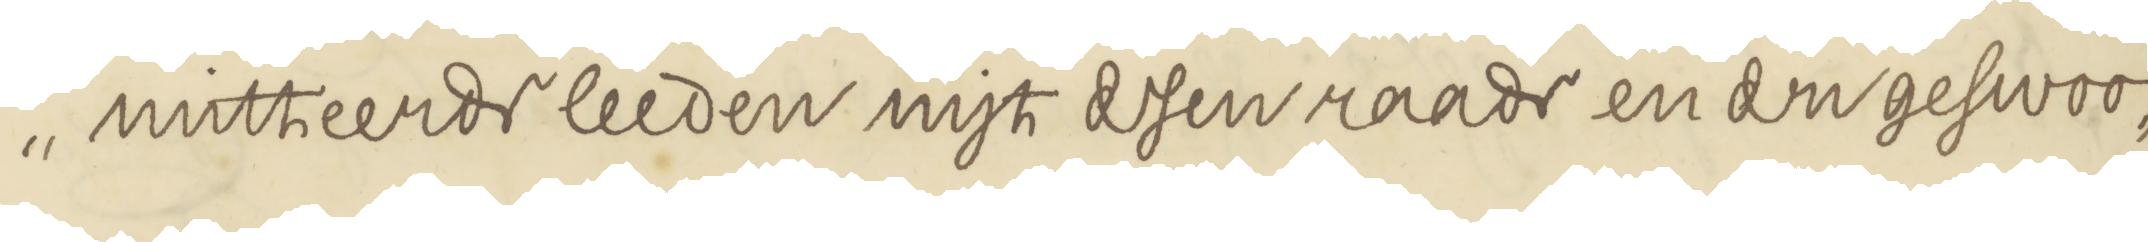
„mitteerde leeden uijt desen raade en den geswoo
